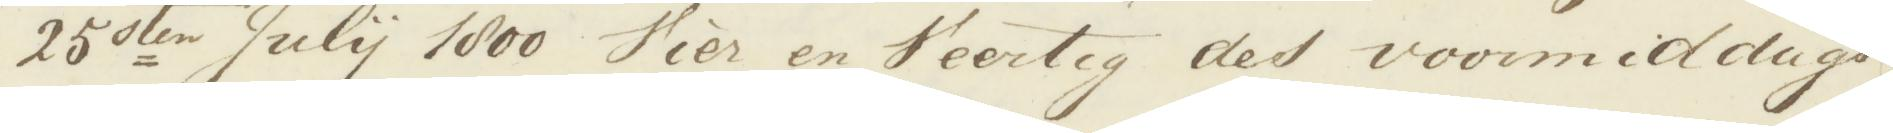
25=sten Julij 1800 Vier en Veertig des voormiddags
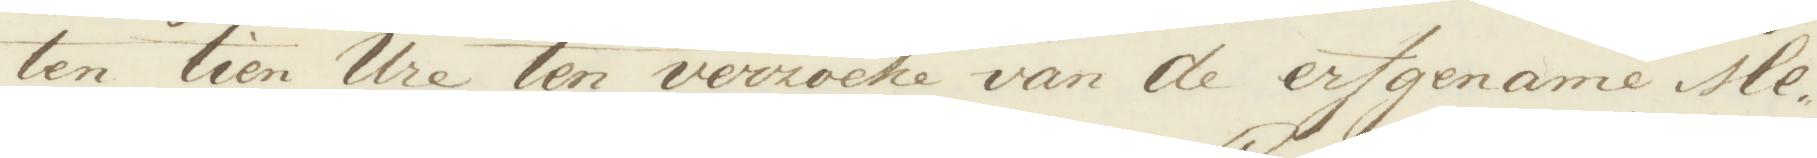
ten tien Ure ten verzoeke van de erfgename Me„
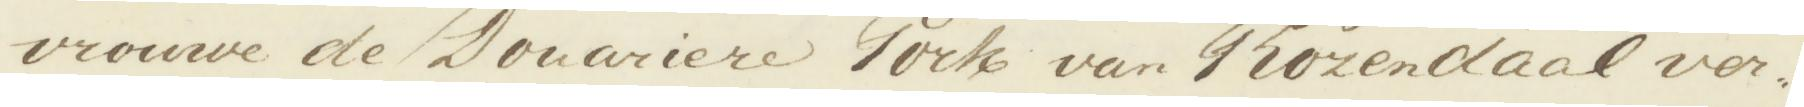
vrouwe de Douariere Tork van Rozendaal ver„
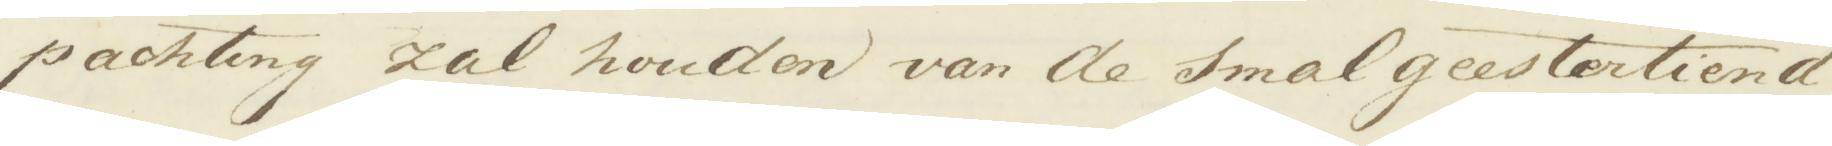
pachting zal houden van de smal geestertiend
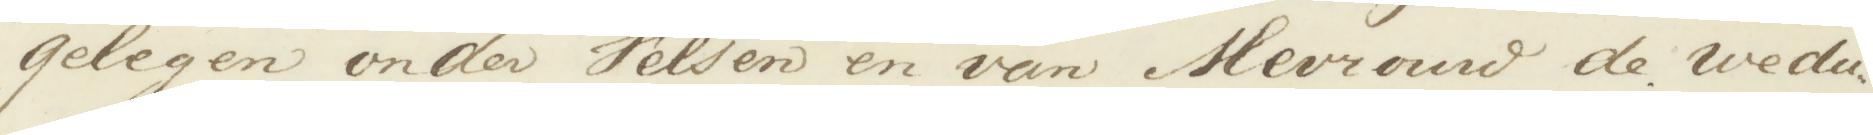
gelegen onder Velsen en van Mevrouw de wedu„
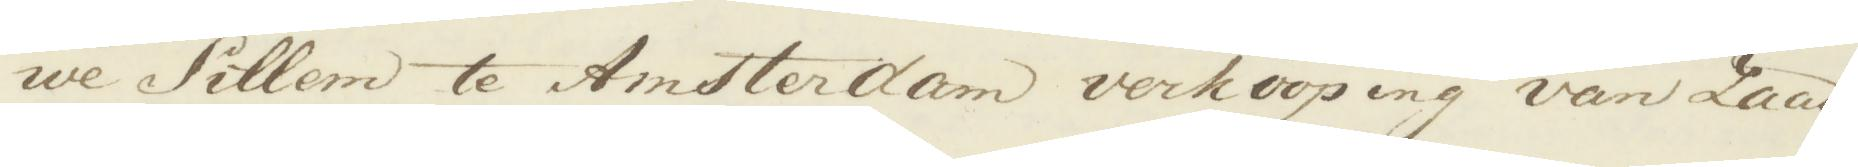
we Sillem te Amsterdam verkooping van Zaad
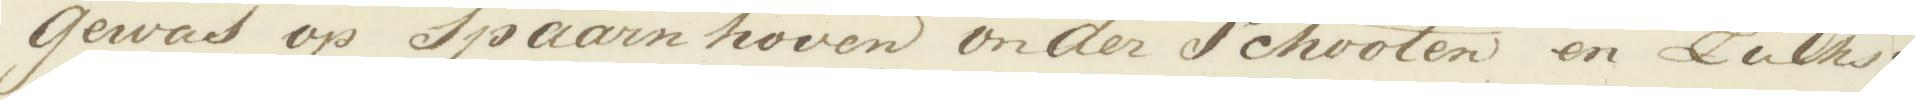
gewas op spaarnhoven onder Schooten en zulks
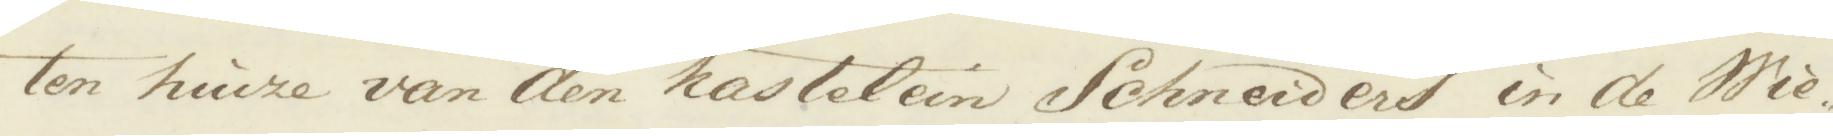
ten huize van den kastelein Schneiders in de Wie„
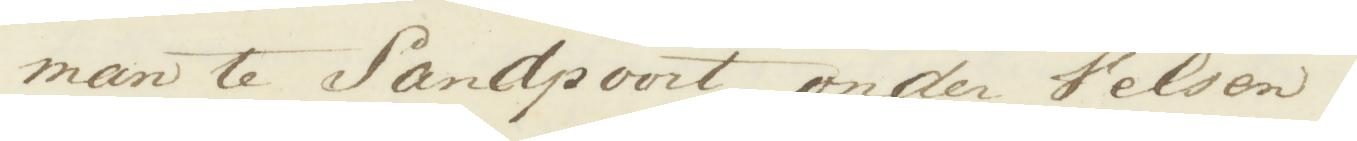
man te Sandpoort onder Velsen .
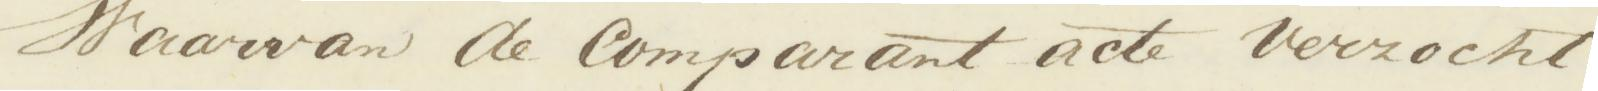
Waarvan de Comparant acte verzocht
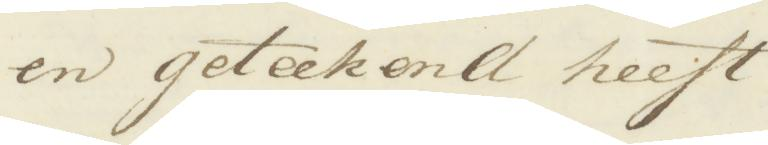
en geteekend heeft
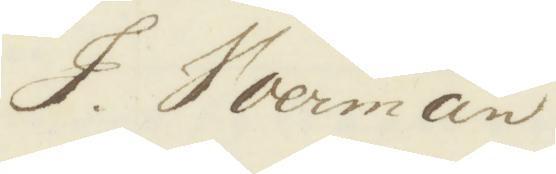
J. Voerman
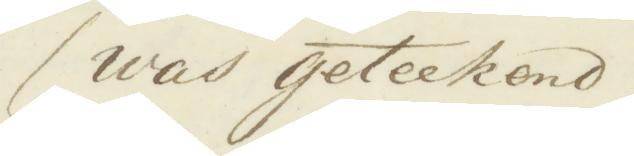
(was geteekend )
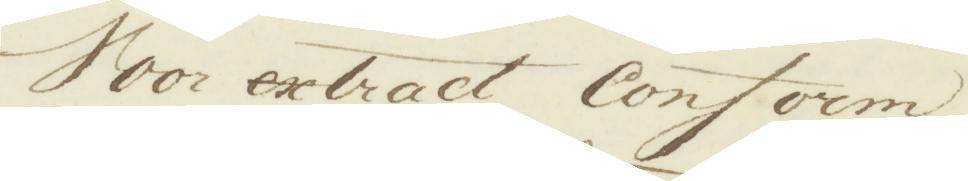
Voor extract Conform
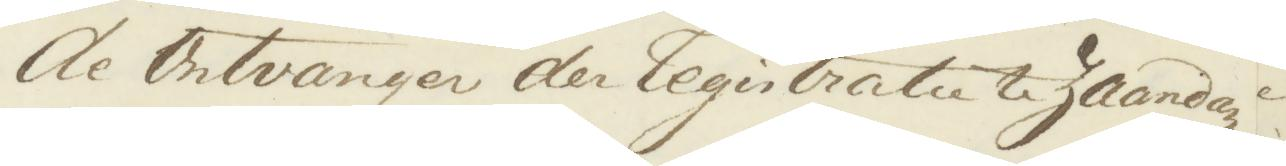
de Ontvanger der Registratie te Zaanden
